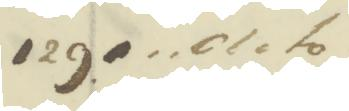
129. 1 „ dito
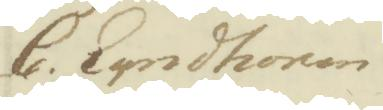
C. Eyndhoven
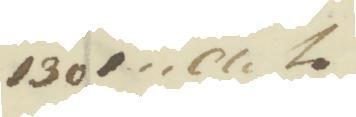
130. 1 „ dito
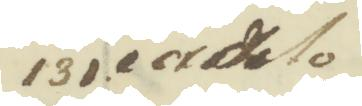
131. 1 „ dito
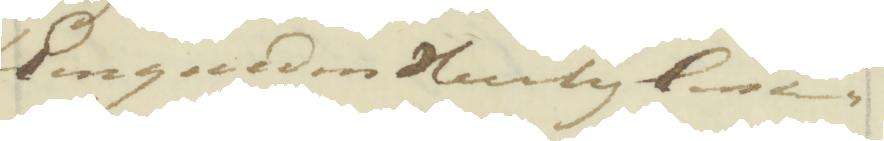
Een gulden Veertig Cent „
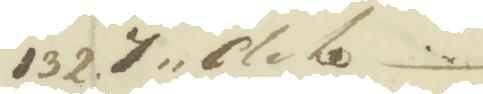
132. 7 „ dito
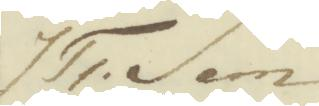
J T. Sem
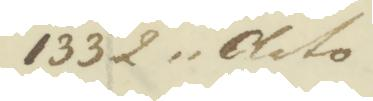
133 2 „ dito
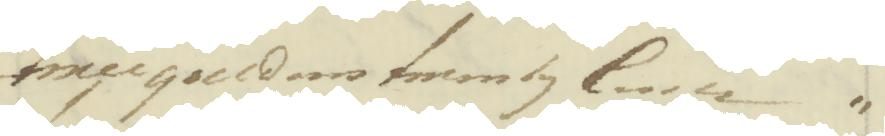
twee guldens twintig Cent „
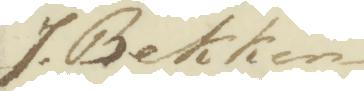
J. Bekken
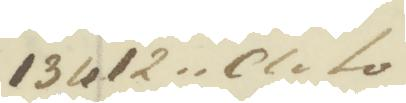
134. 12. „ dito
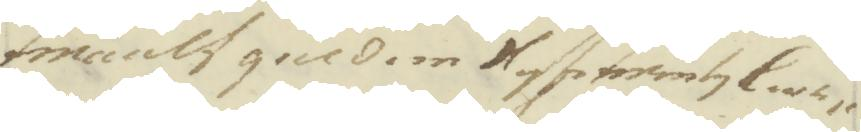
twaalf guldens Vyf en twintig Cent „
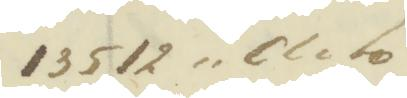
135 12 „ dito
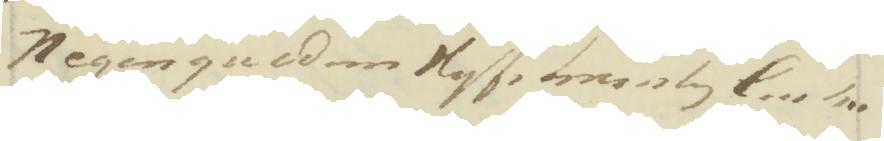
Negen guldens Vyf en twintig Cent
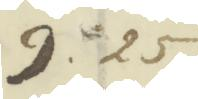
9. 25
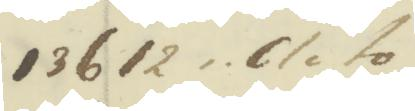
136 12 „ dito
